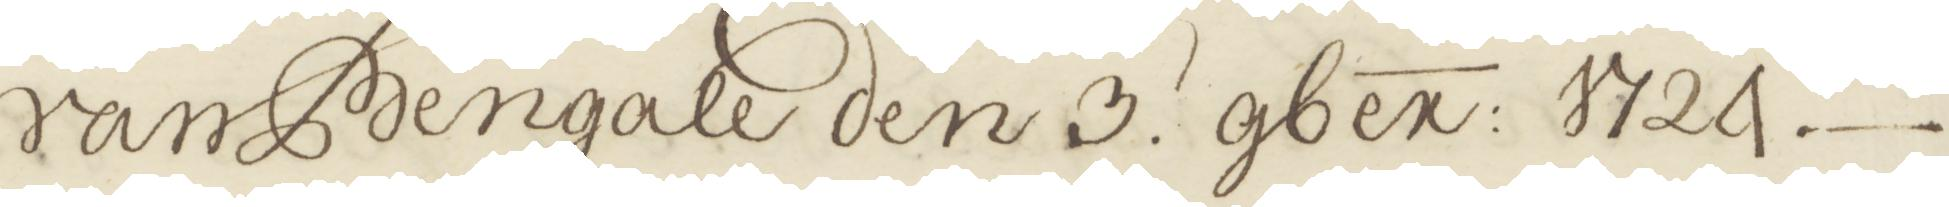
van Bengale den 3.' 9ber: 1724. —
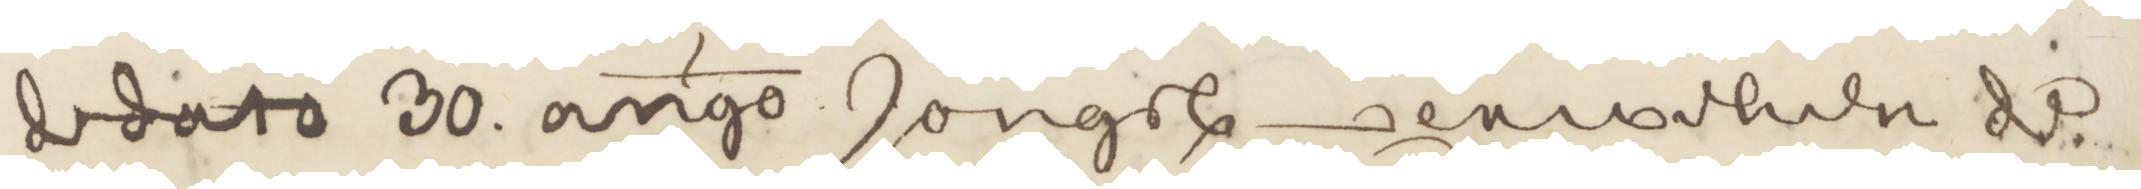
de dato 30. augo Jongst verweken de
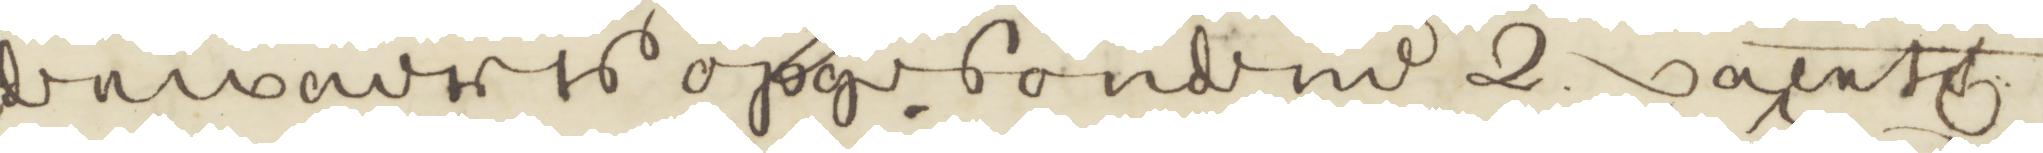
derwaerts opgesondene 2. vaerts:
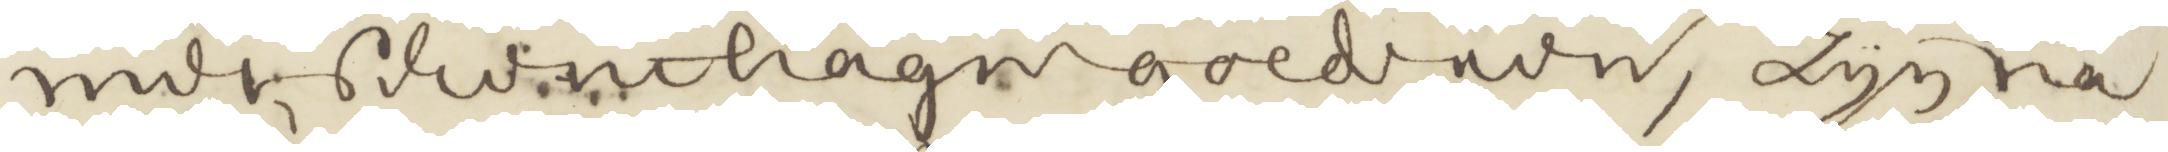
met schenckagie goederen, zijn na
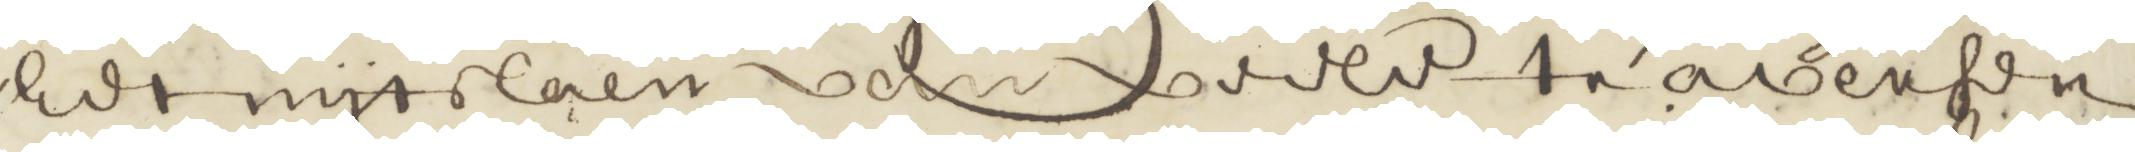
het uijtstaen van veele traversen
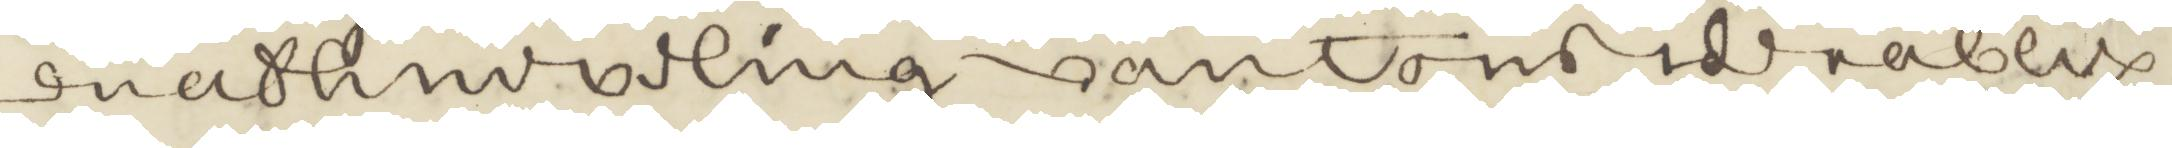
en afkneveling van Considerablen
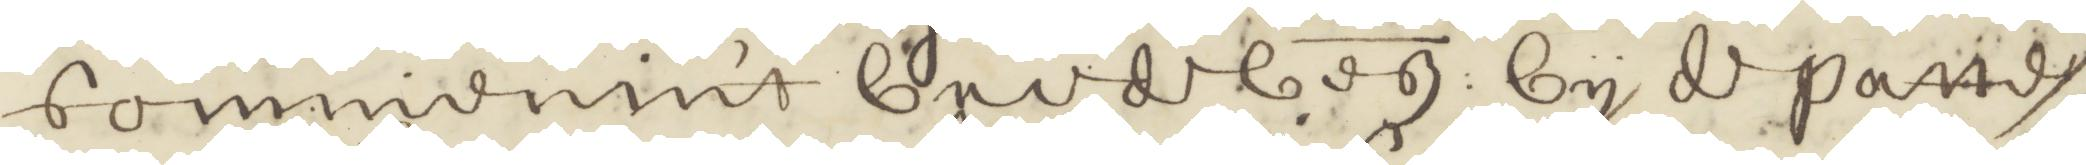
sommen in 't bredebes: bij de patte
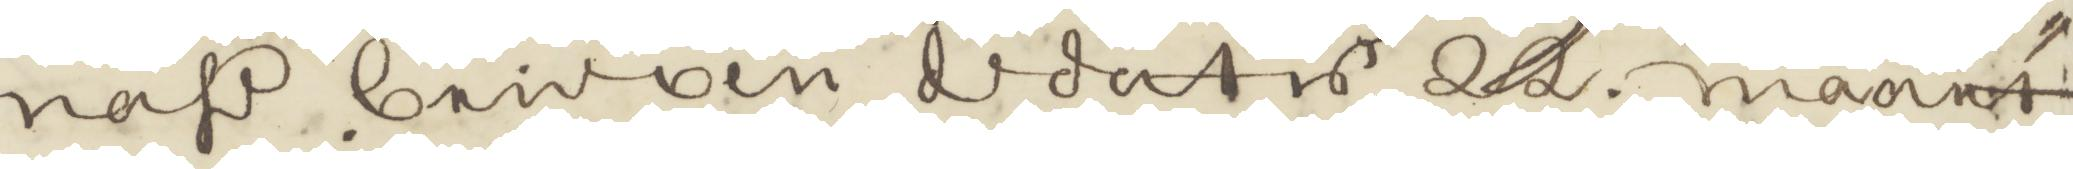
nase brieven de datis 22. maart
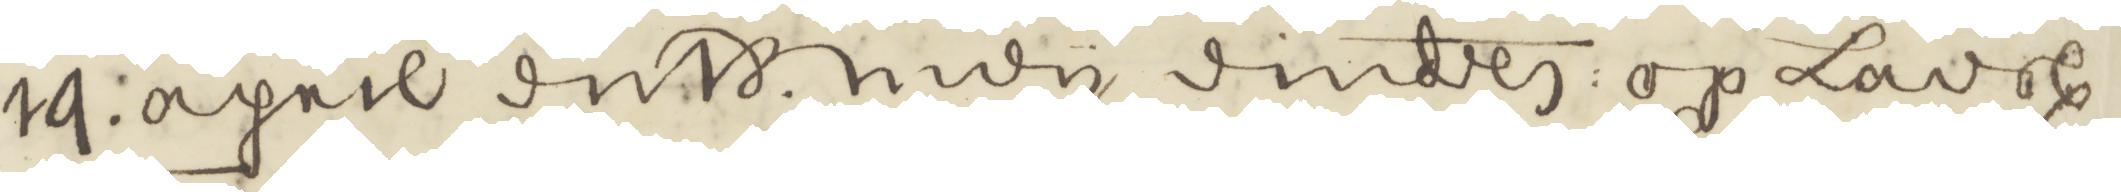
14. april en 18. meij eindelijk op Laest
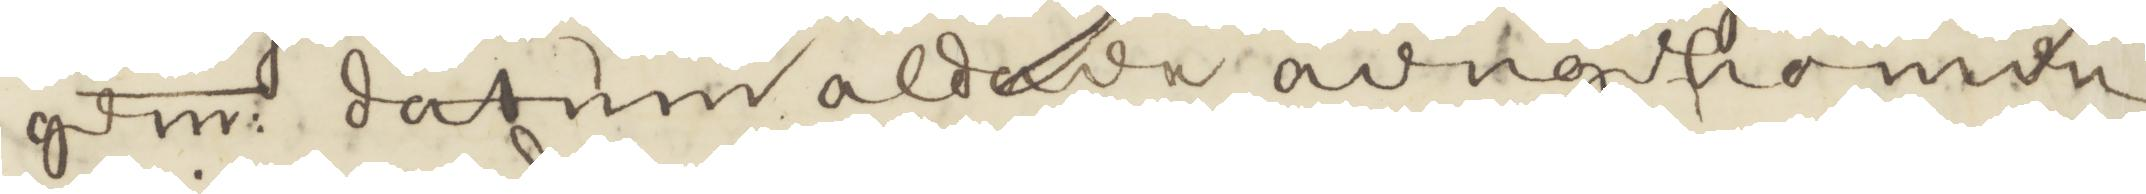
gem: datum aldaer aengekomen
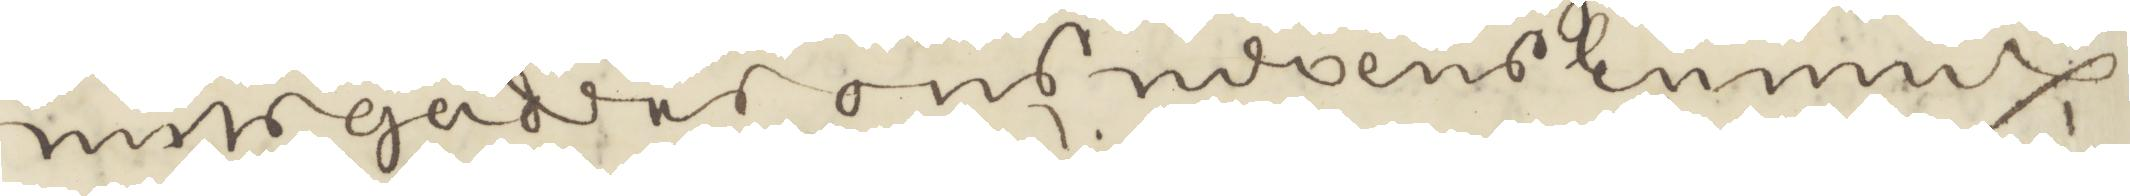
mitsgaders ons nevens hunnen
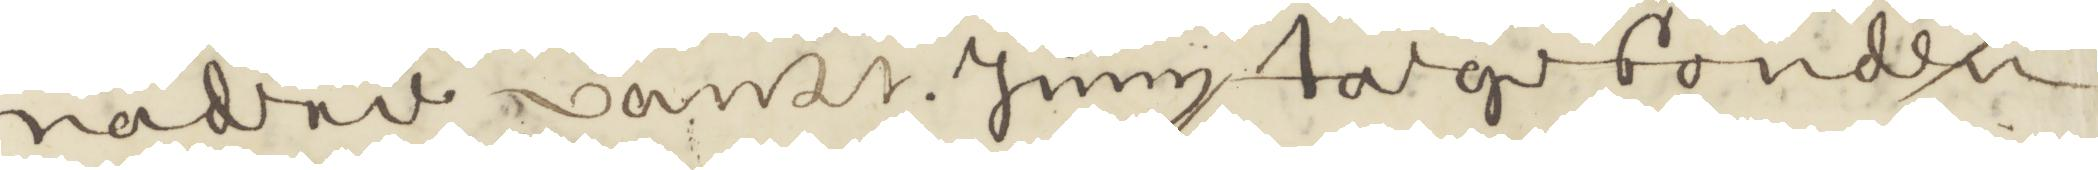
nadere van 21. Junij toegesonden
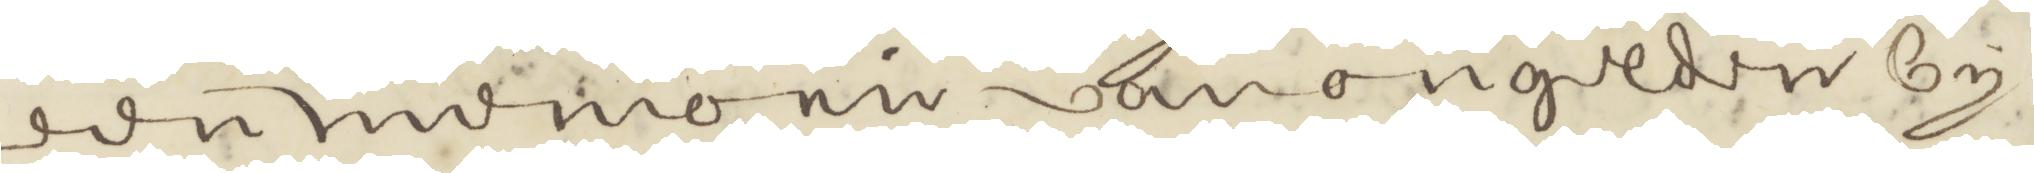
een memorie van ongelden bij
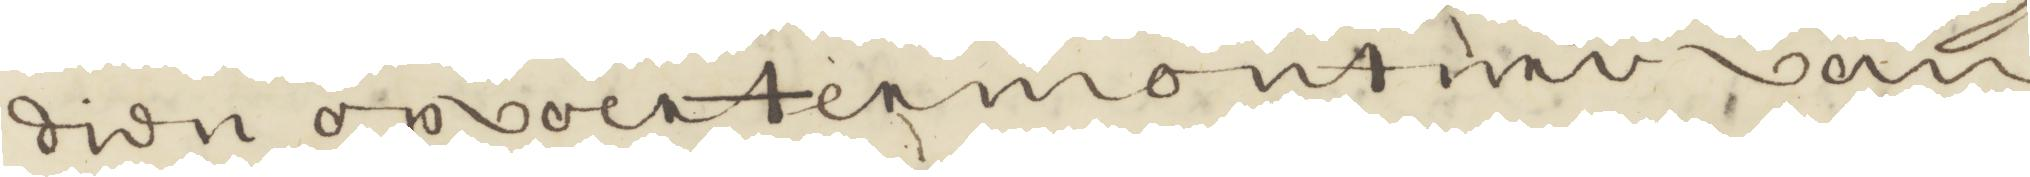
dien opvoer ter monture van
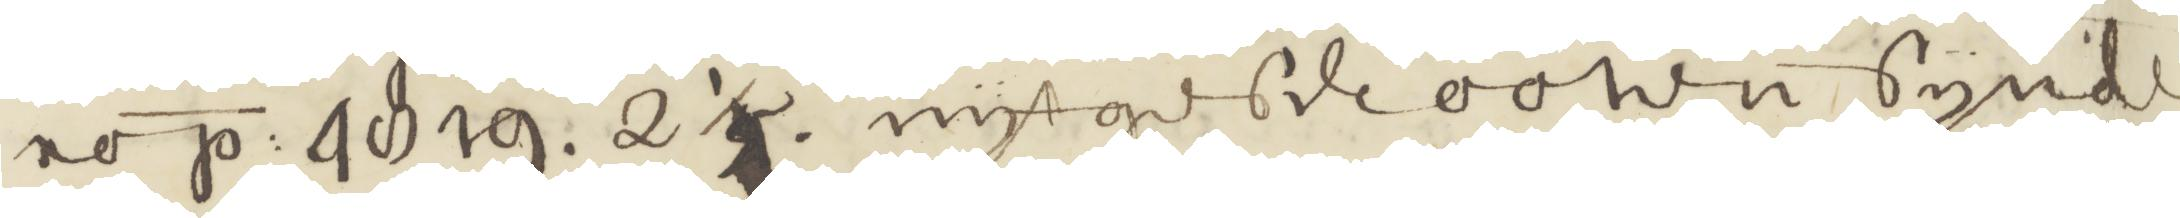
rop: 4819. 2¼. uijtgeschooten sijnde
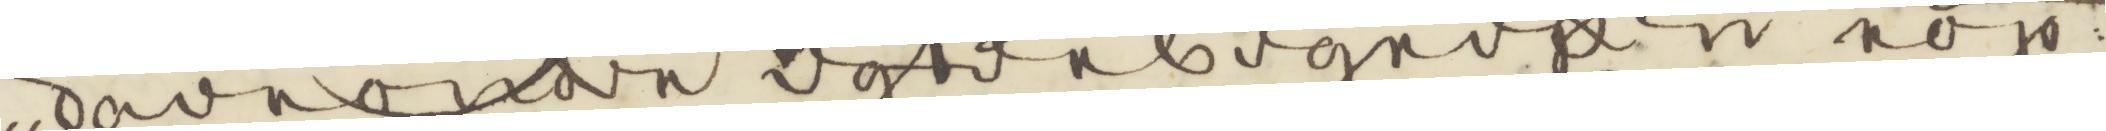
„daeronder egter begrepen rop:
